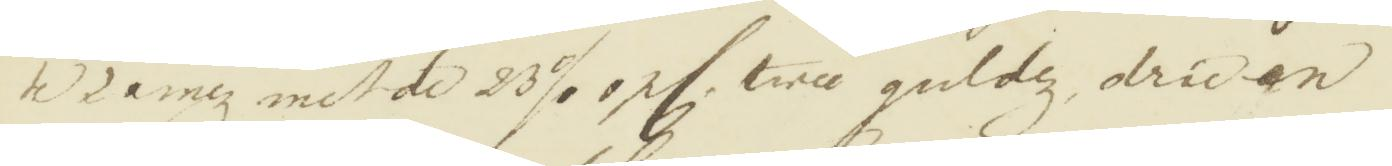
te zamen met de 23% opC. twee gulden, drie en
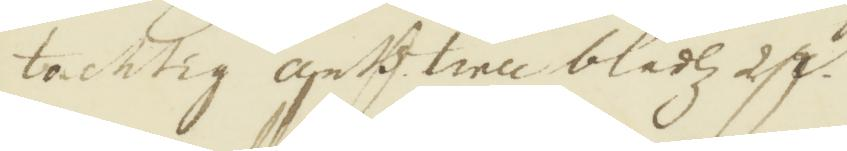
tachtig cents twee bladen 2p.s
